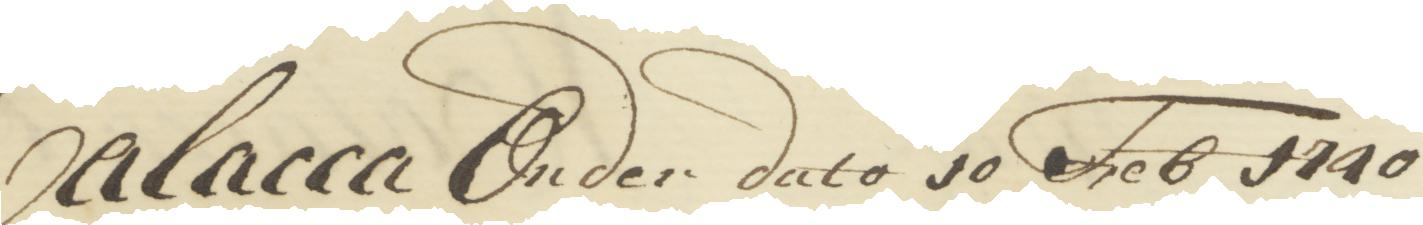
Van Malacca Onder dato 10 Feb 1740
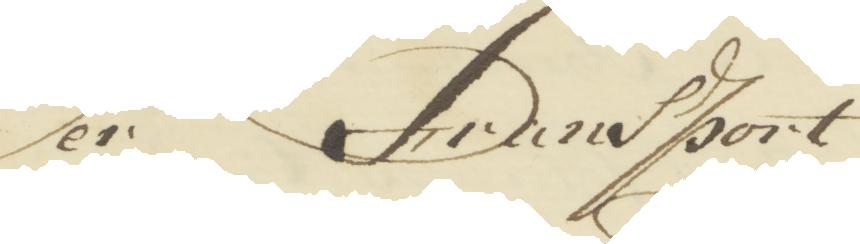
23 Vaartuijgen Per Transport
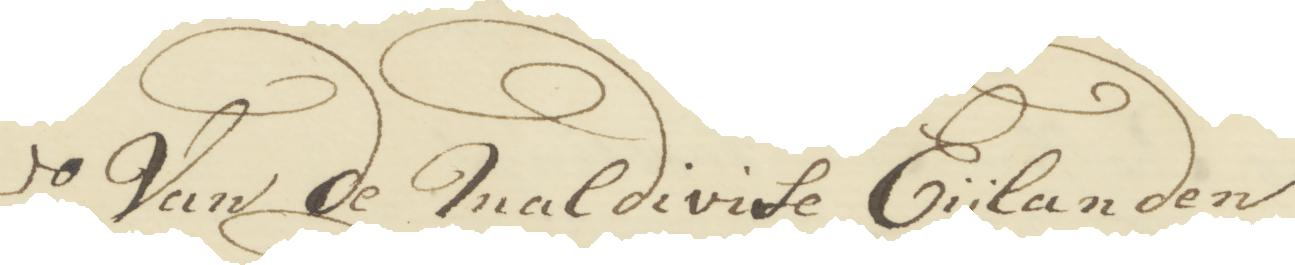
1 _„o van de maldivise Eijlanden
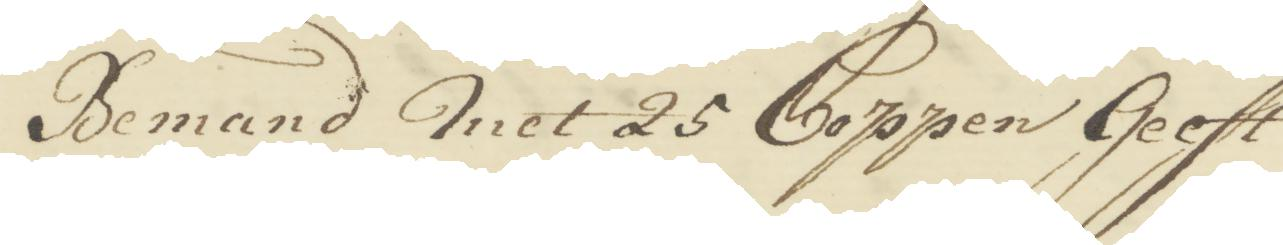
Bemand met 25 Coppen Geeft
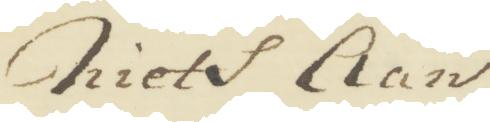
niets Aan . . . . .
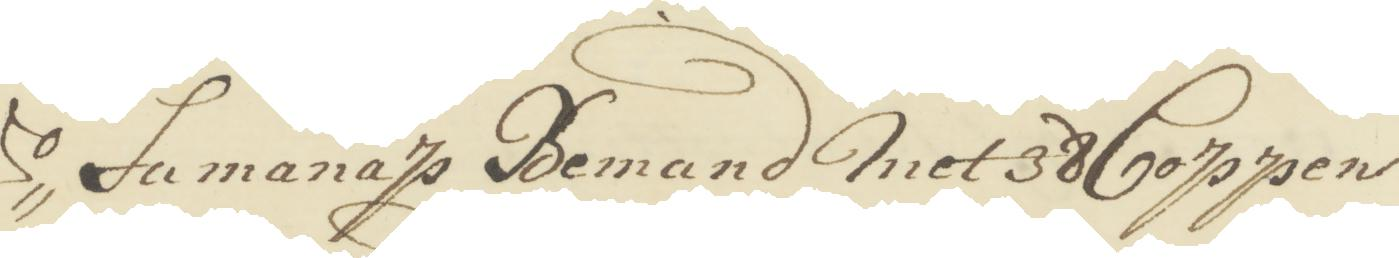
2 _„o Sumanap Bemand met 38 Coppen
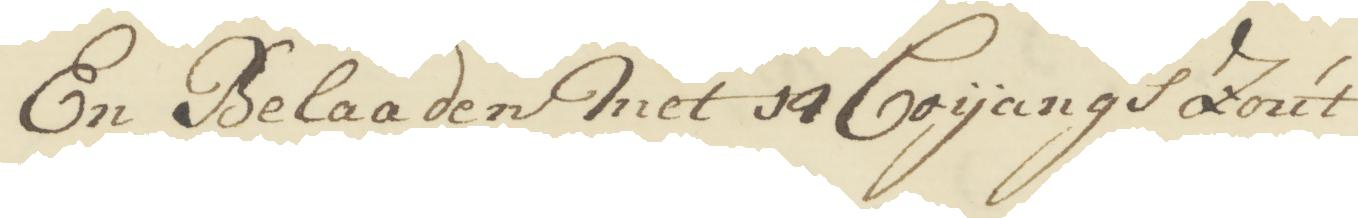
En Belaaden met 14 Coijangs zout
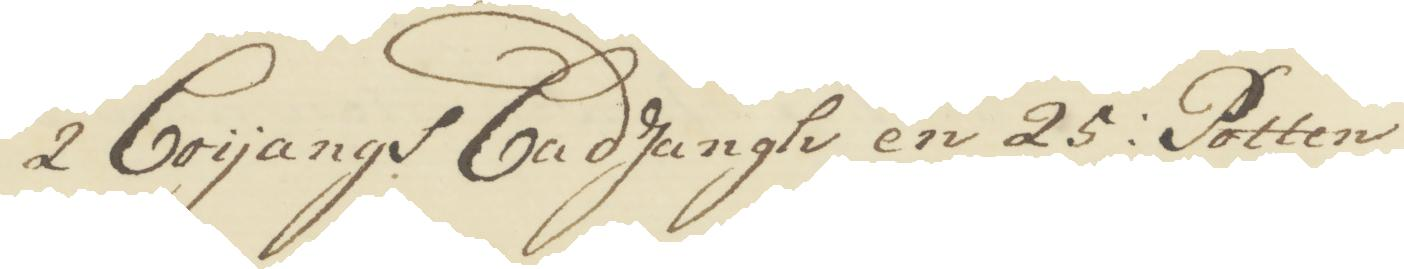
2 Coijangs Cadjangh en 25: Potten
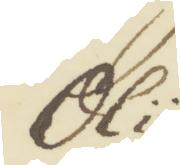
Olij . . . . . . .
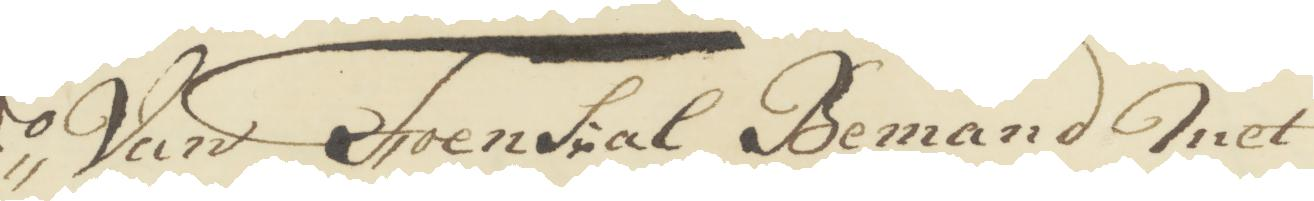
1 _„o Van Toensial Bemand met
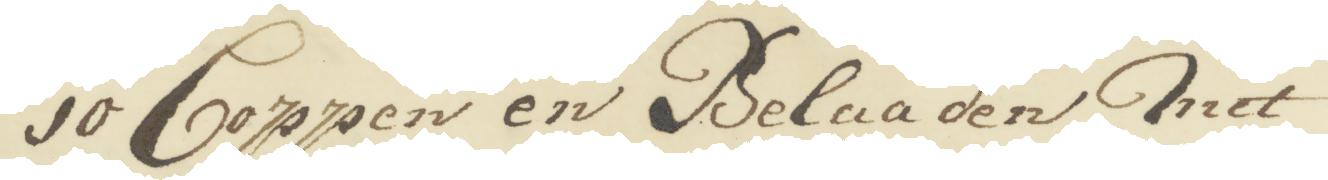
10 Coppen en Belaaden met
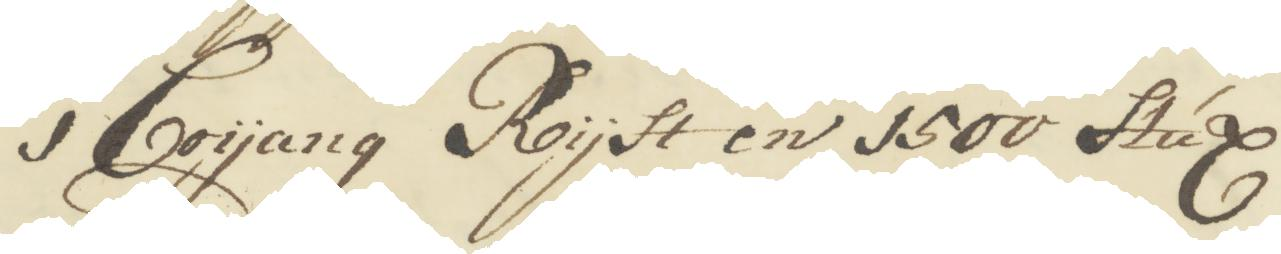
1 Coijang Rijst en 1500 stux
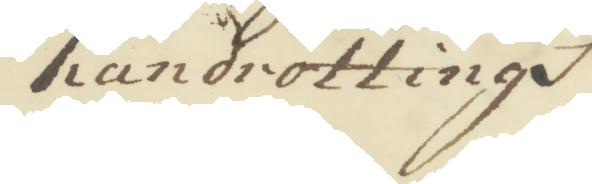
handrottings . . . . . .
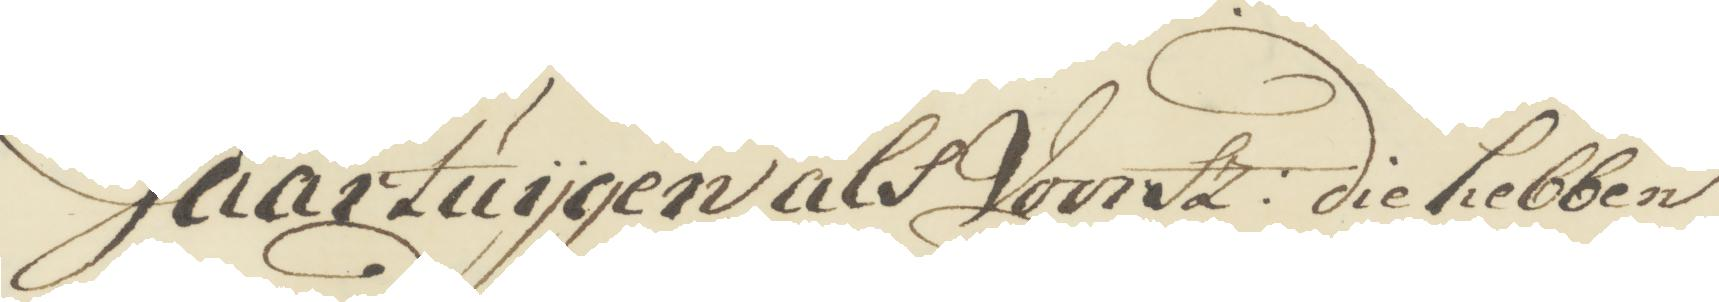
27 Vaartuijgen als voorsz: die hebben
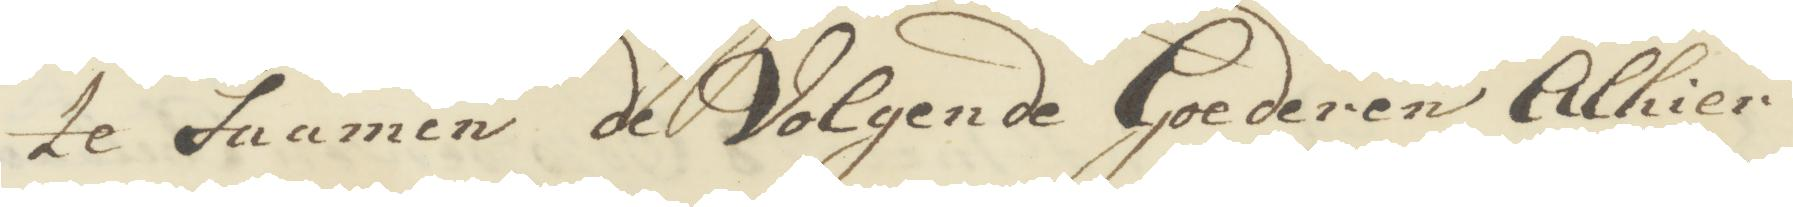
te saamen de Volgende Goederen alhier
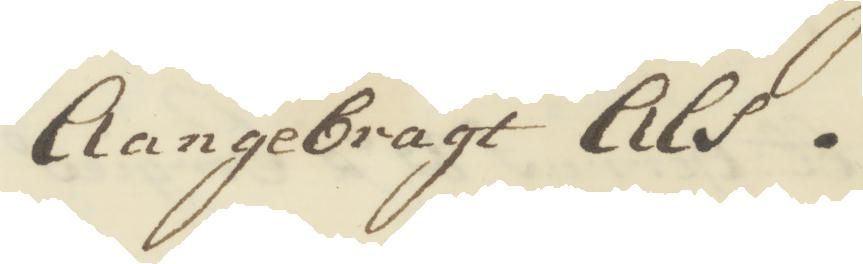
Aangebragt als.
